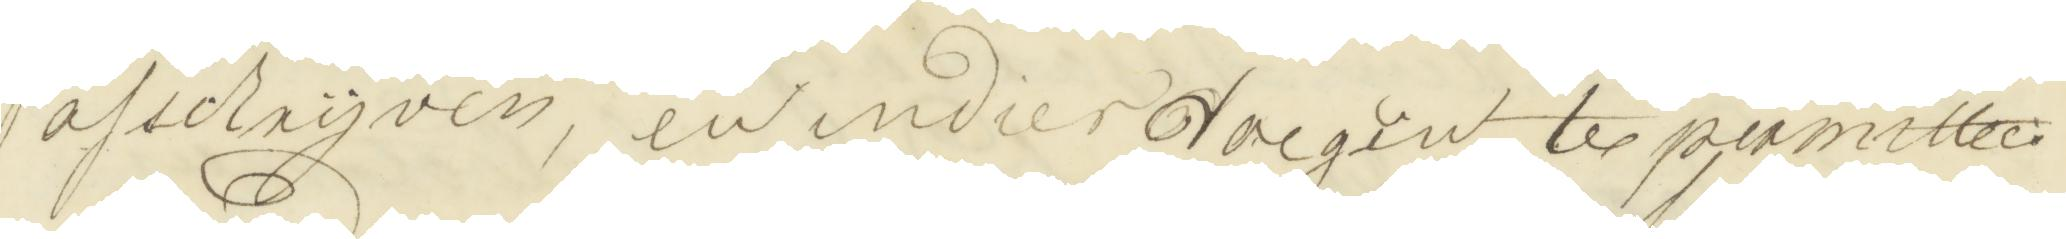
afschrijven, en in dier voegen te permittee
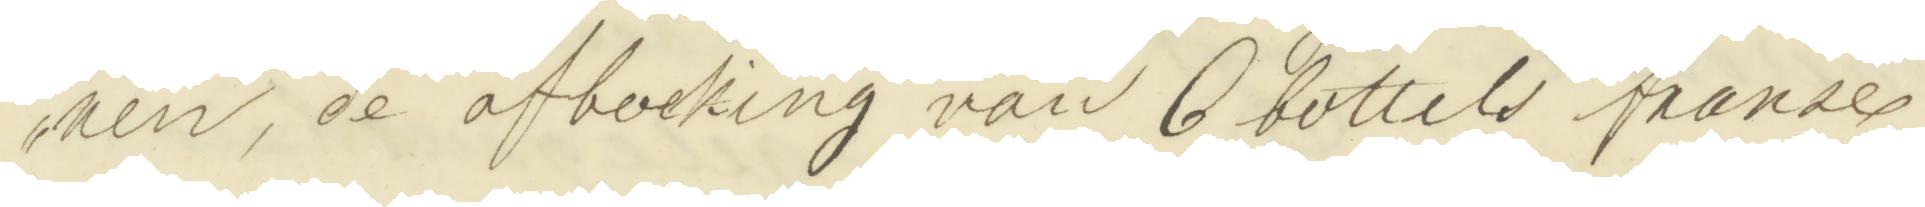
„ren, de afboeking van 6 bottels franse
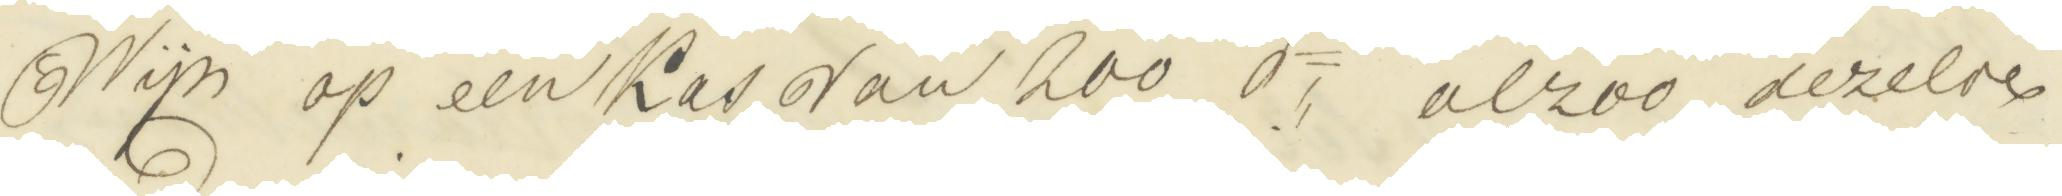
wijn op een kas van 200 d„=os alzoo dezelve
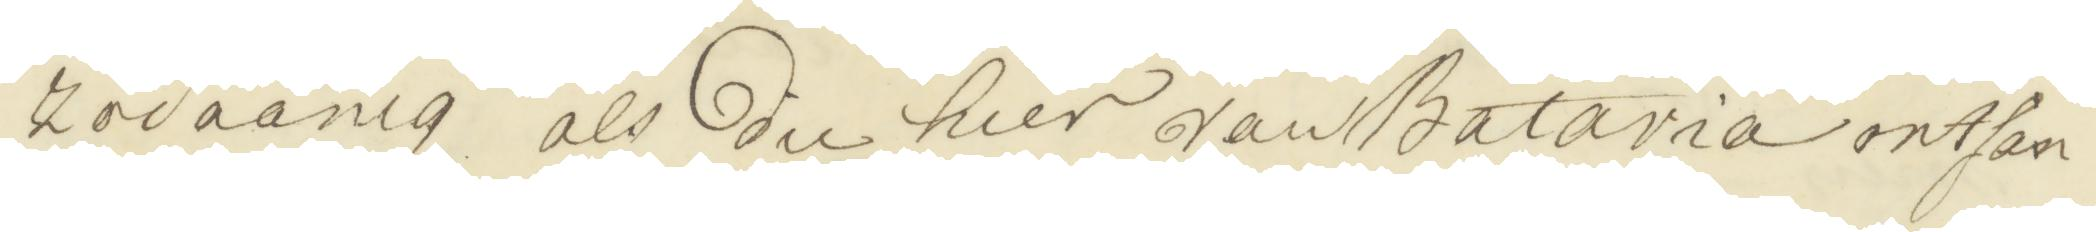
zodaanig als de hier van Batavia ontfan
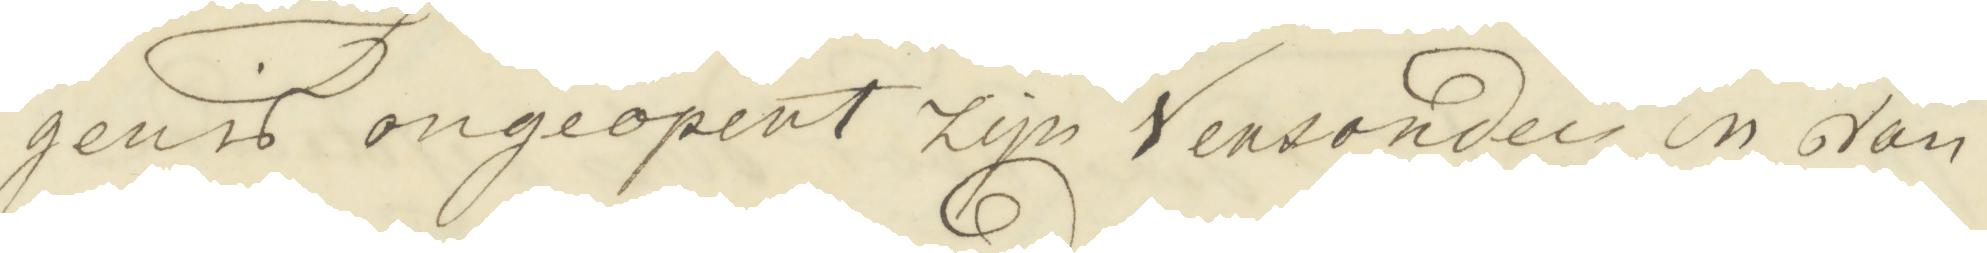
gen is ongeopent zijn versonden in van
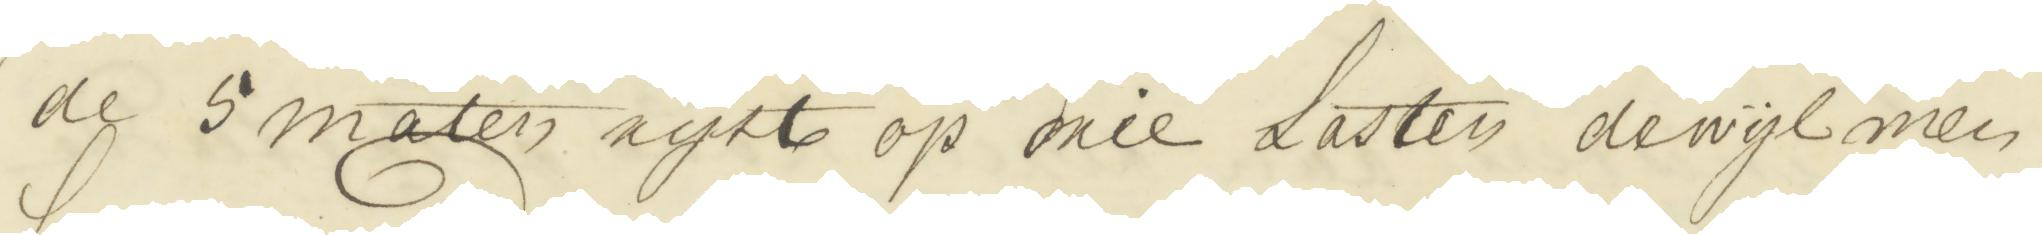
de 5 maten rijst op drie lasten dewijl men
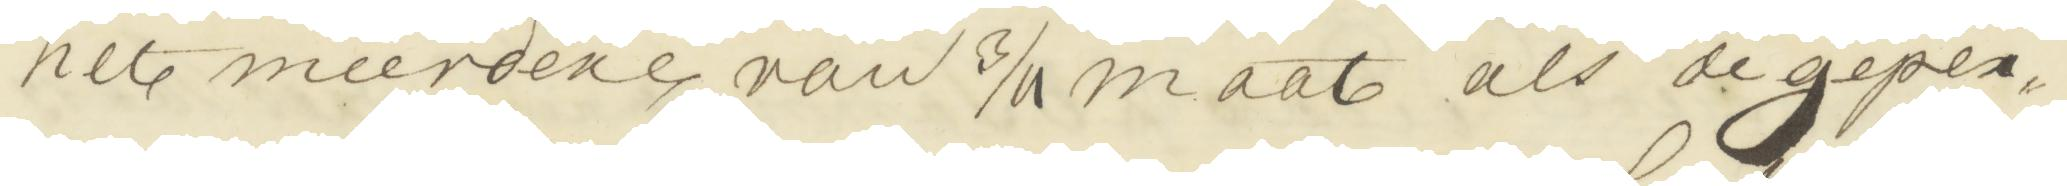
het meerdere van ¾ maat als de geper„
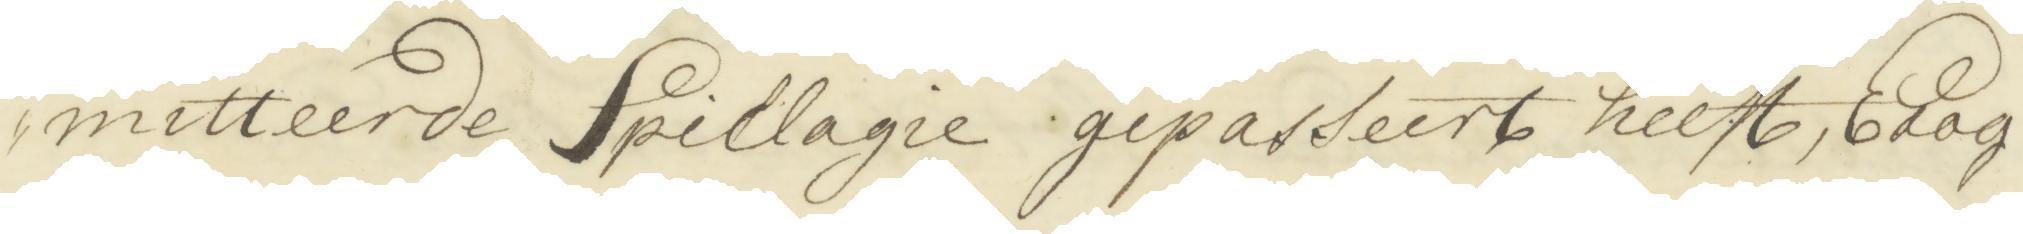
„mitteerde spillagie gepasseert heeft, Edog
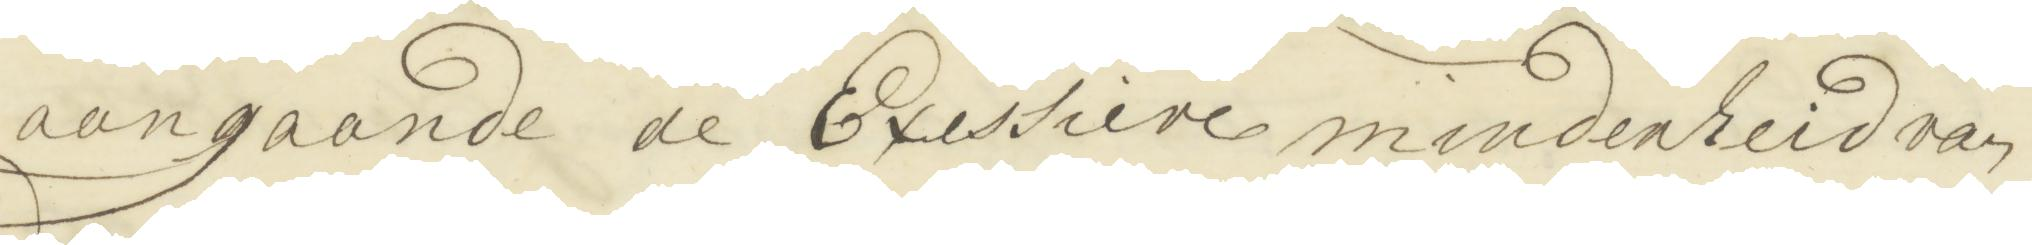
aangaande de Exessieve minderheid van
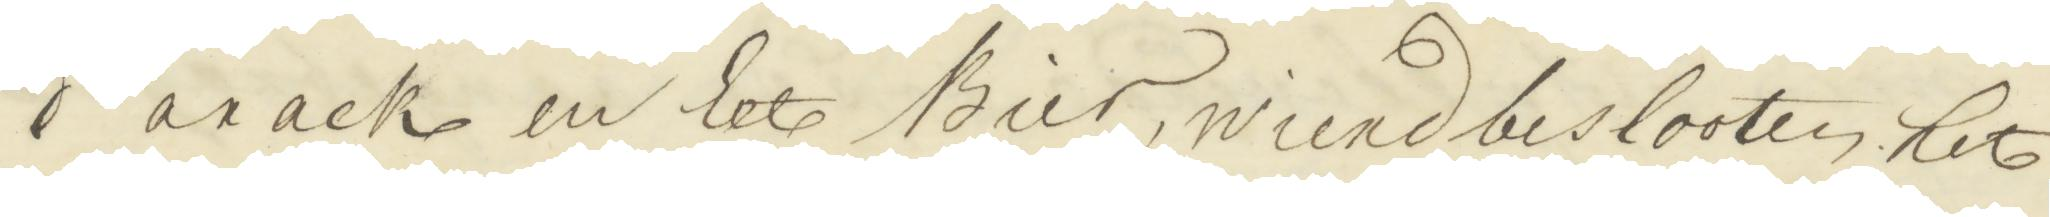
d'arack en het Bier, wierd beslooten het
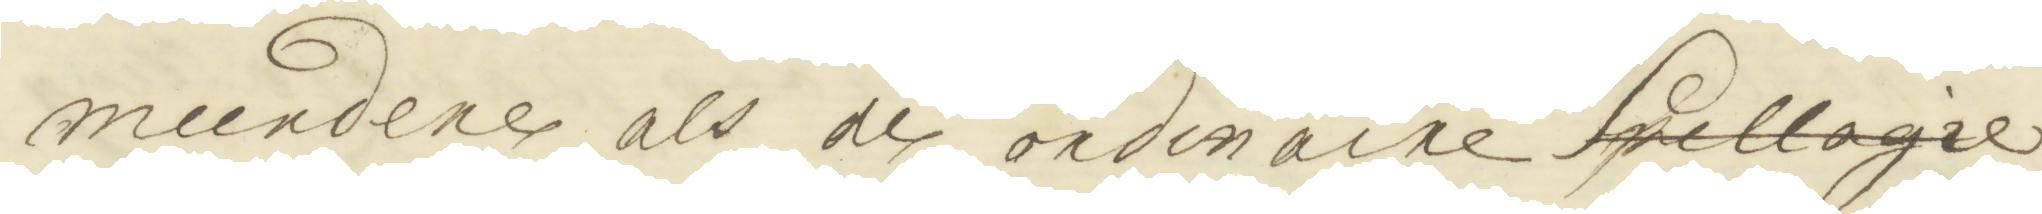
meerdere als de ordinaire spillagie
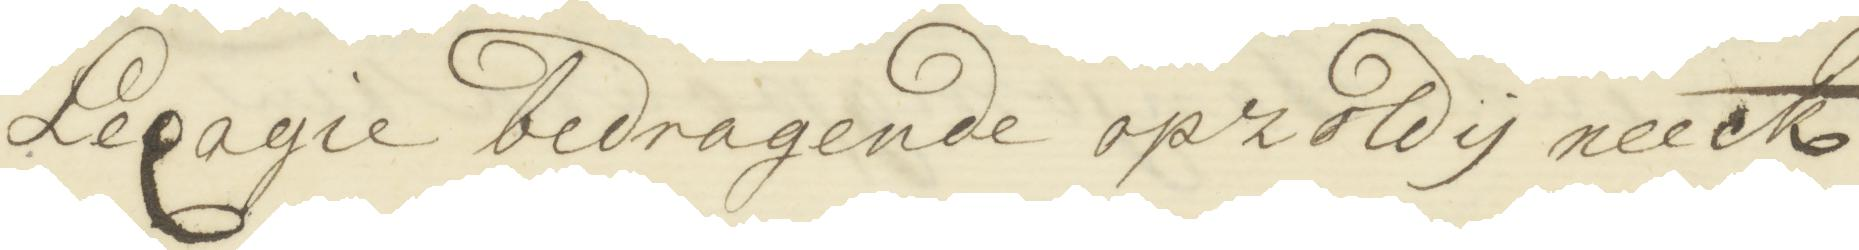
leqagie bedragende opzoldij reeck
